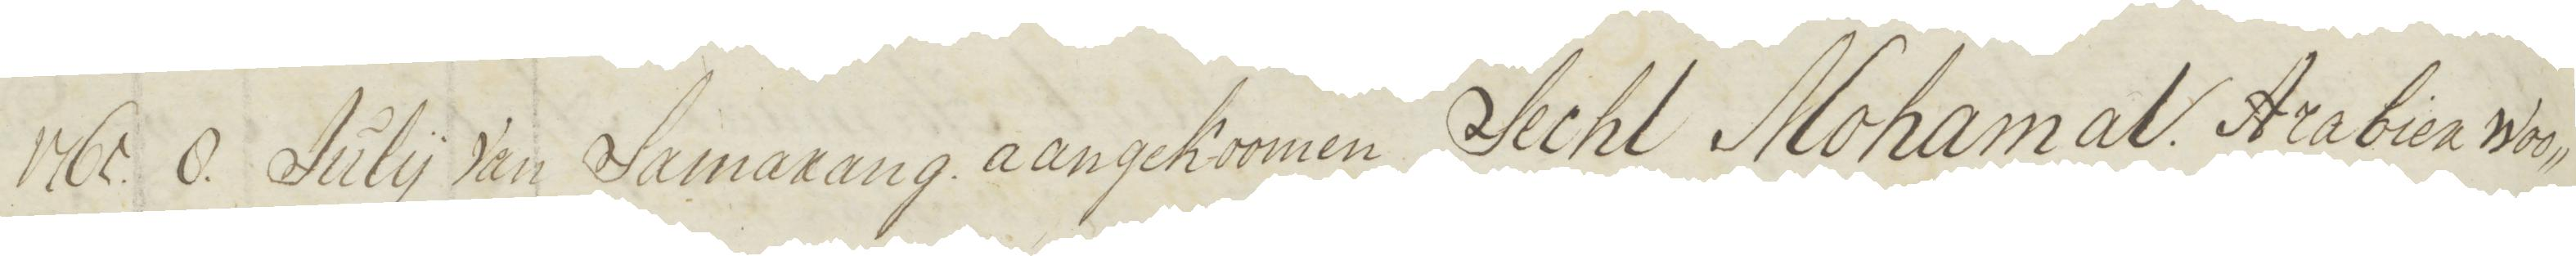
1765. 8. Iulij van Samarang. aangekoomen Secht Mohamat. Arabier woo„
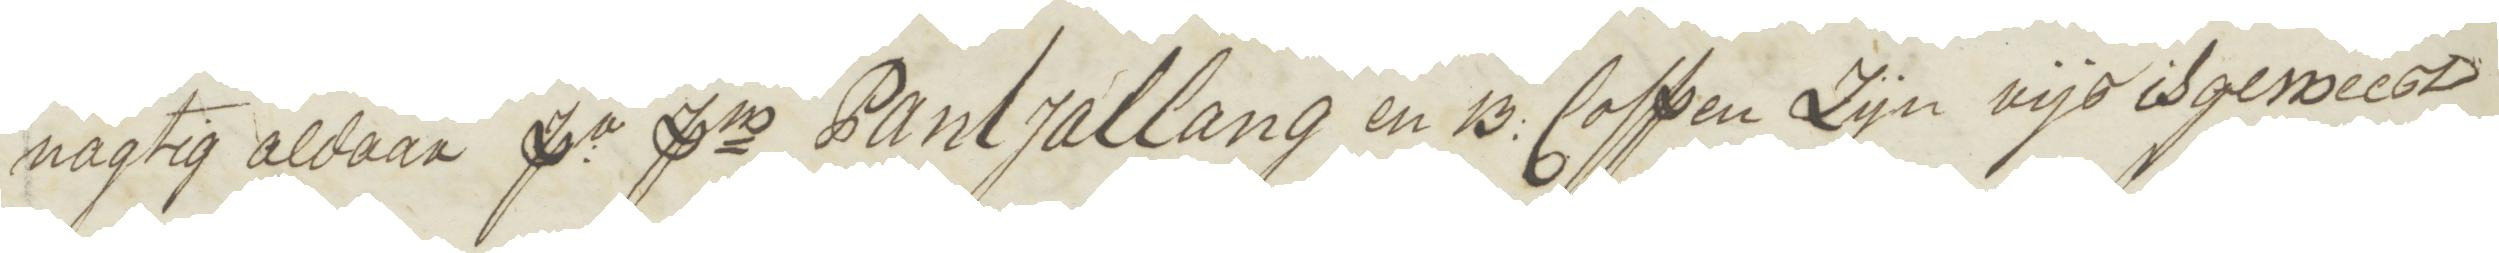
nagtig aldaar p:r p=w Pantjallang en 13: Coppen Zijn rijs is geweest
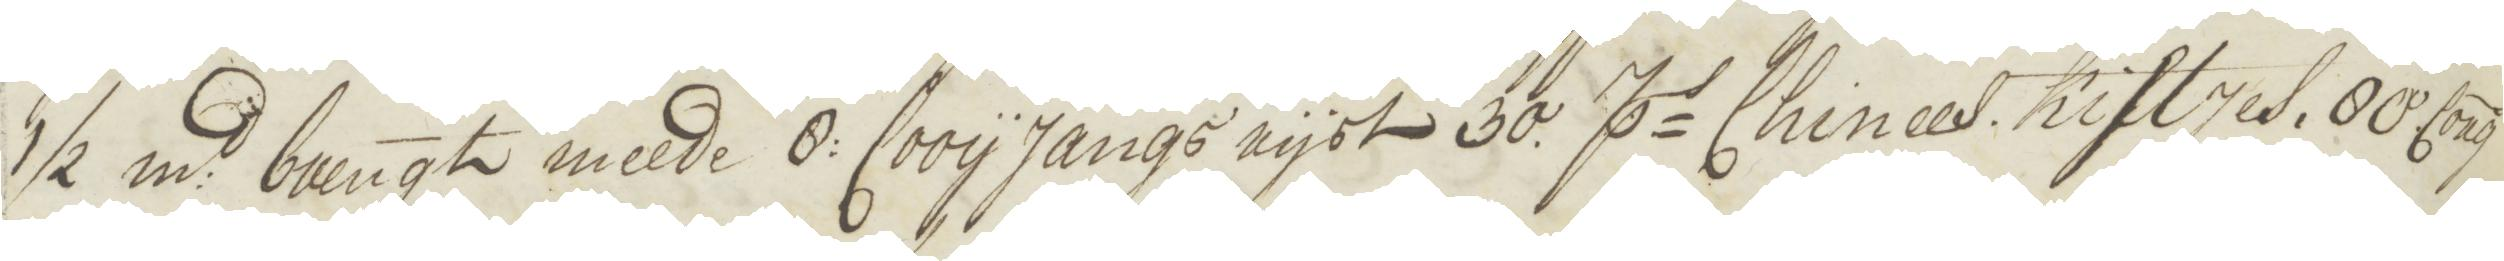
½ m:d brengt meede 8: Cooij Jangs rijst 30. p=s Chinees. kistjes. 80 Corg:e
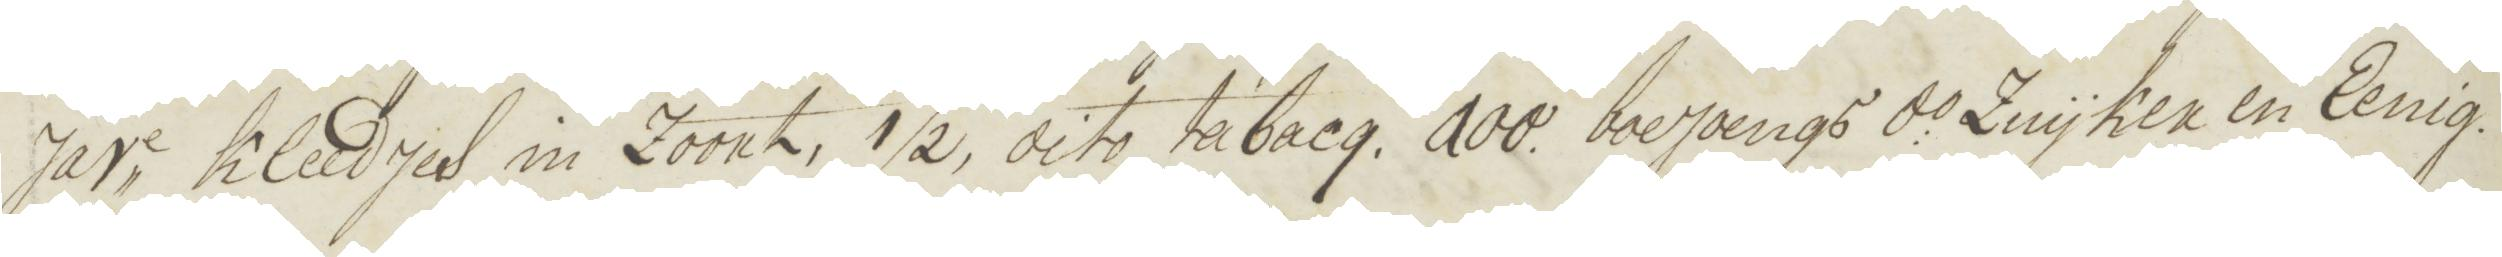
Jav„e kleedjes in Zoort, ½, dito tabacq. 400. boejoengs d:o Zuijker en Eenig.
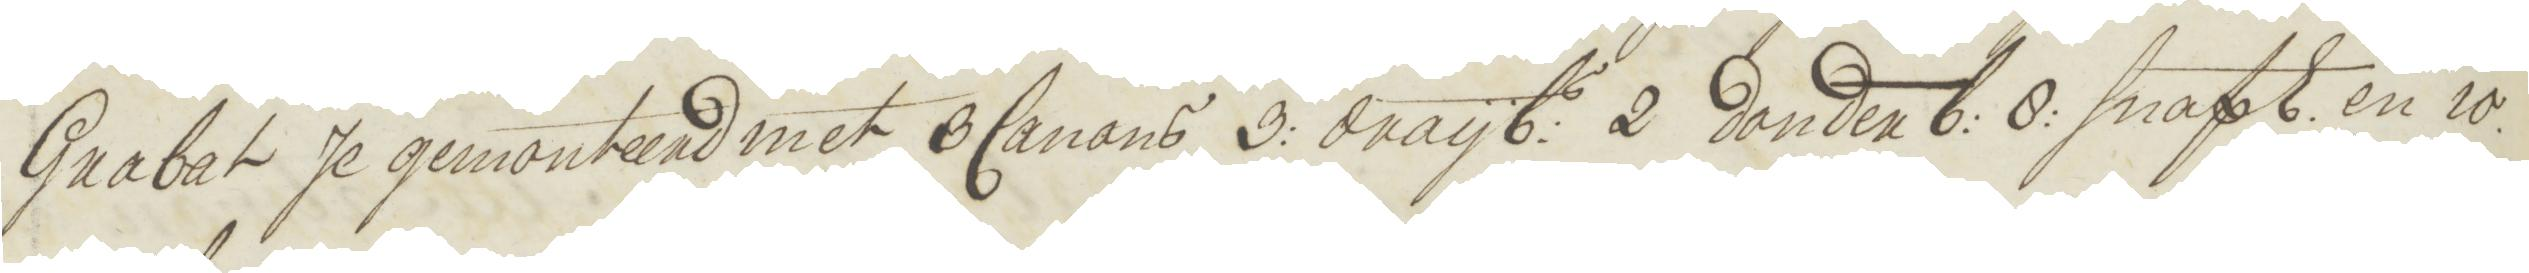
Grabat Je gemonteerd met 3 Canons 3: draijb:s 2 donderb: 8: snaph. en 10.
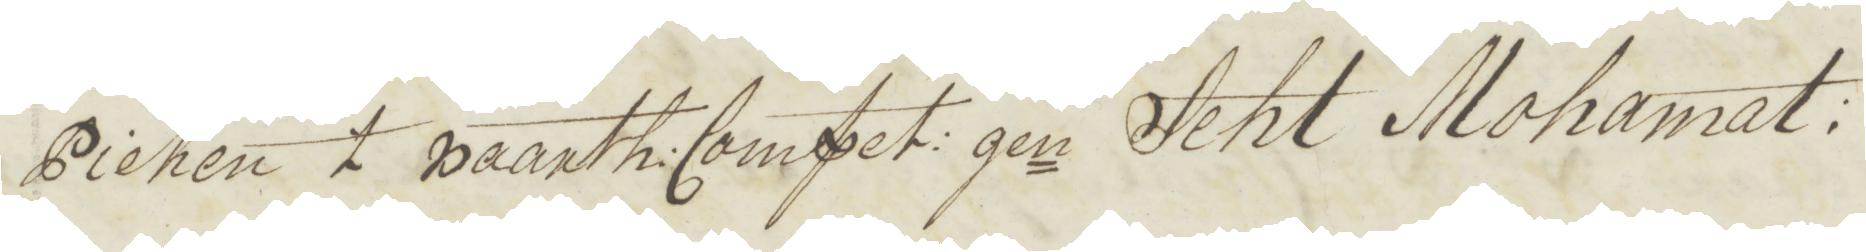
Pieken ’t vaarth: Compet: gen Seht Mohamat;
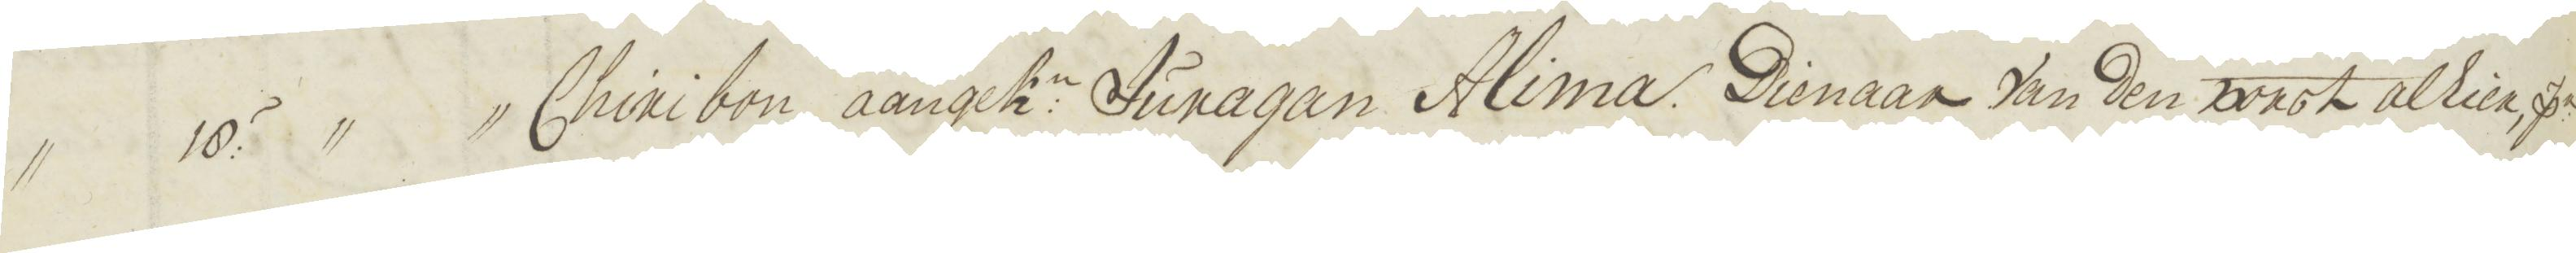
„ 18:' „ „ Chiribon aangek:n Iuragan Alima. Dienaar van den vorst alhier, p:r
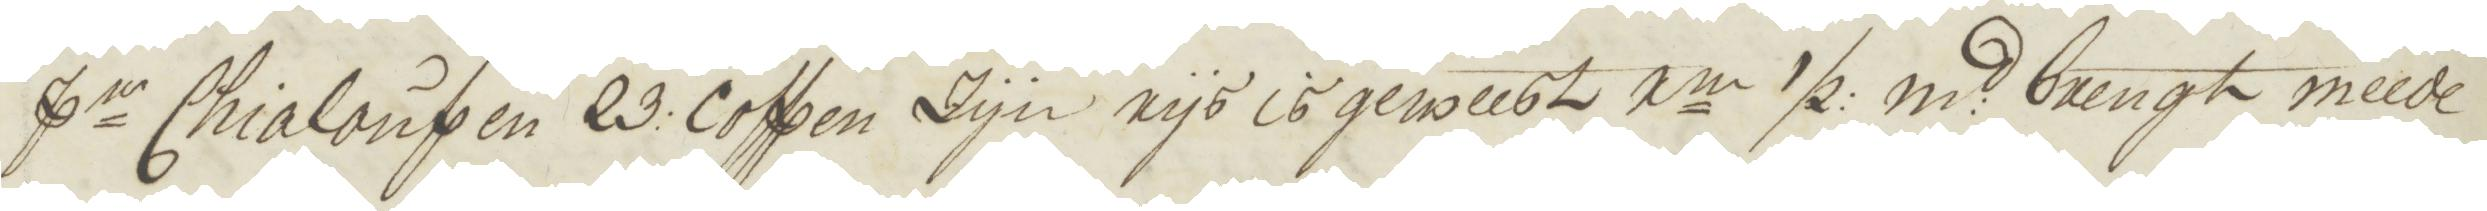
p=r Chialoup en 23: coppen Zijn rijs is geweest r=m ½: m:d brengt meede
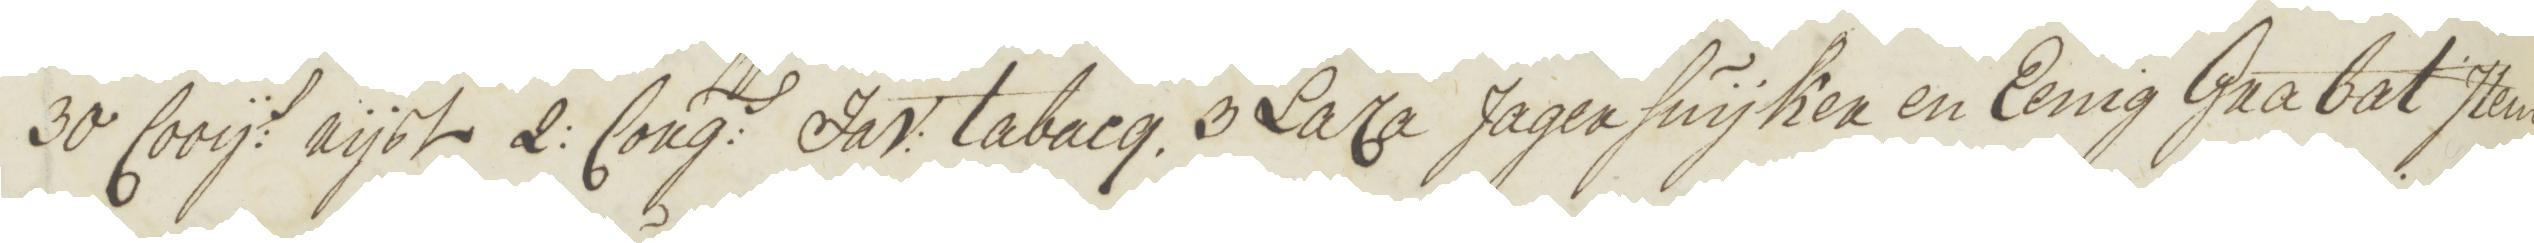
30 Cooij:s rijst 2: Corg:s Iav: tabacq. 3 Laca Jager Suijker en Eenig Grabat Jtem
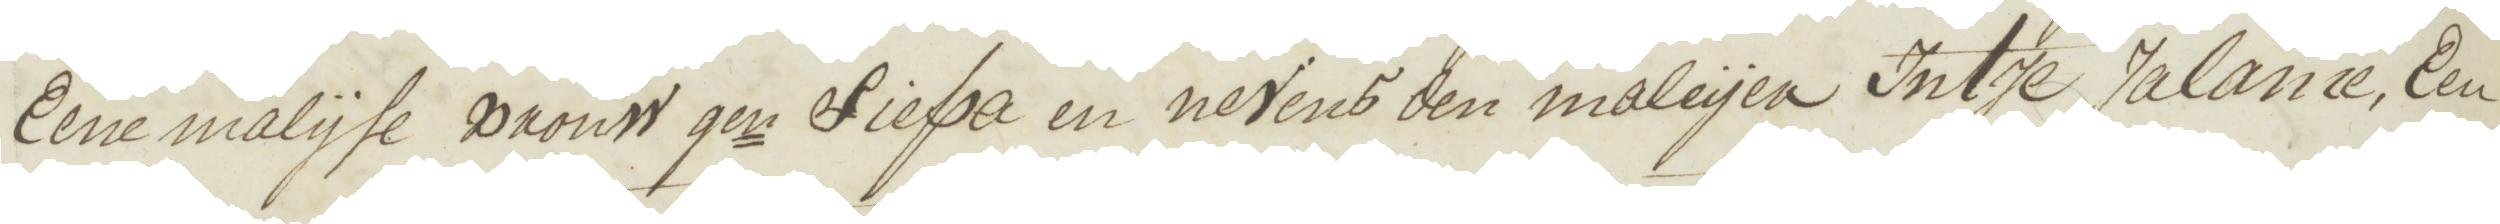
Eene malijse vrouw gen Siepa en nevens den maleijer Intje Jalanie, Een
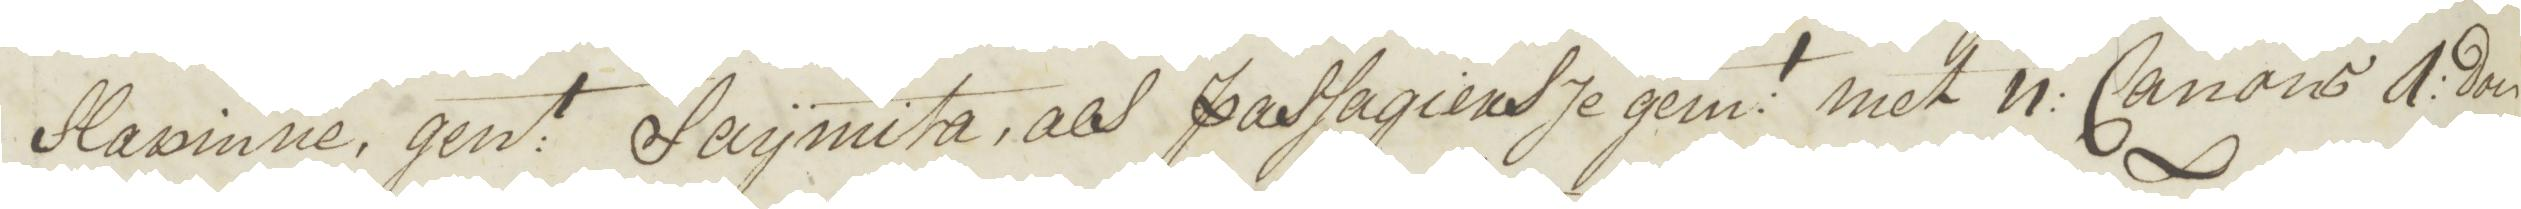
Slavinne, gen:t Saijmita, als passagiersje gem:t met 11: Canons 4: don
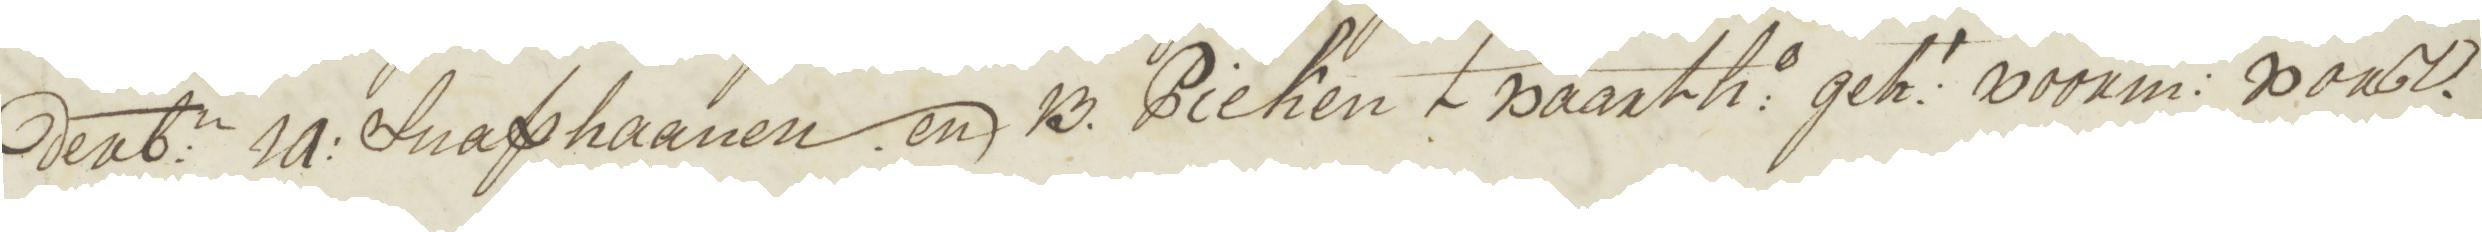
derb:n 14: snaphaanen en 13. Pieken t vaarth:g geh:t voorm: vorst.
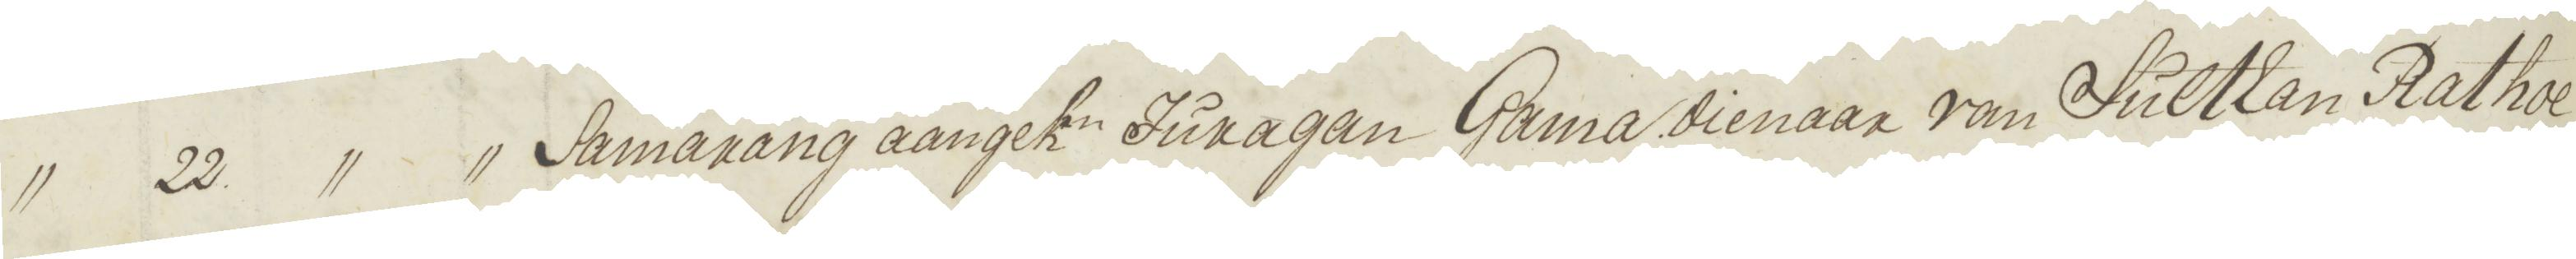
„ 22 „ „ Samarang aangek:n Iuragan Gama dienaar van Sulthan Rathoe
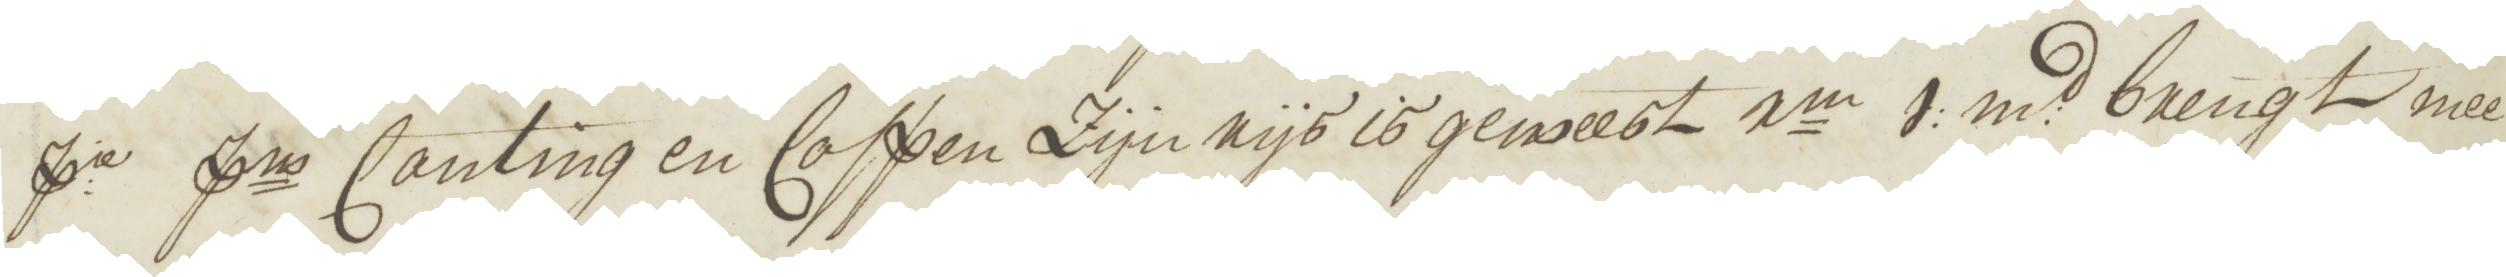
p:r p=w Conting en Coppen Zijn rijs is geweest r=m 1: m:d brengt mee
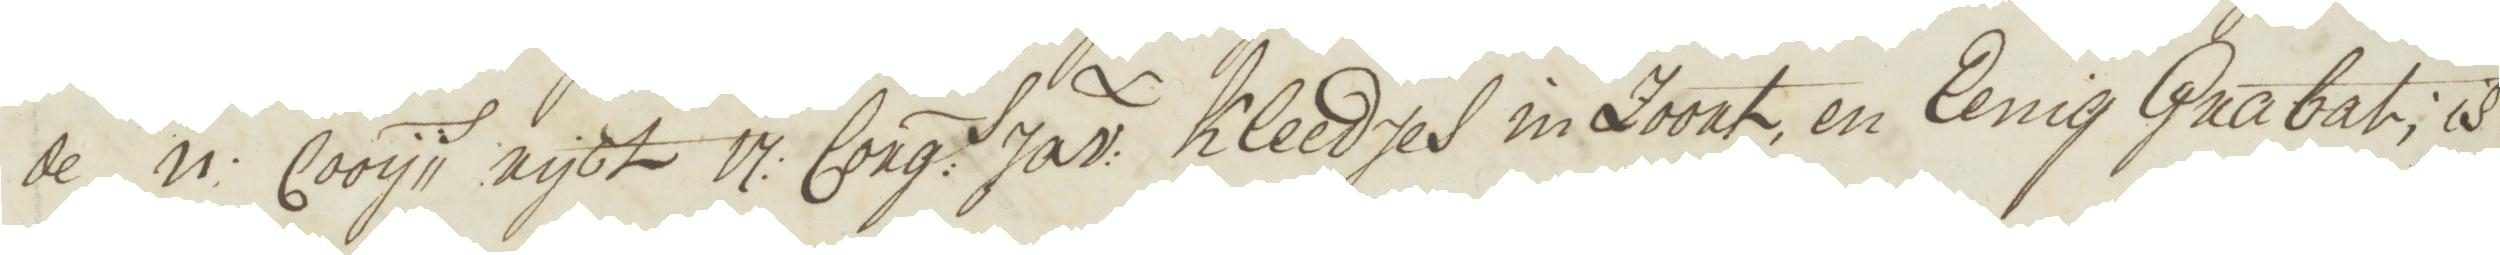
de 11: Cooij„s rijst 17: Corg:s Jav:e kleedjes in Zoort, en Eenig Grabat; is
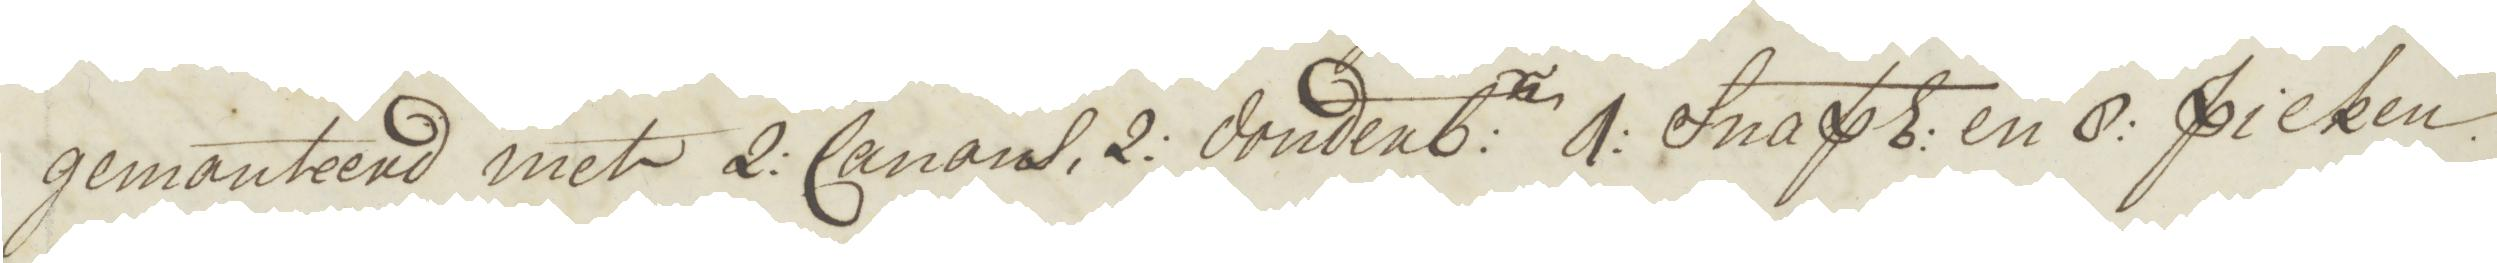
gemnteerd met 2: Canons, 2: donderb:n 4: snaph: en 8: pieken.
